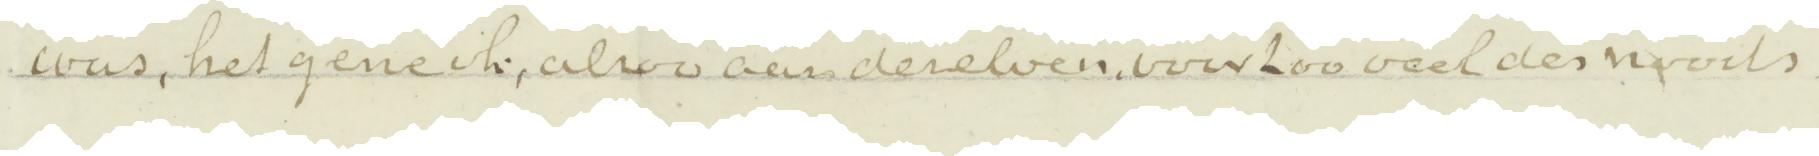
was, het gene ik, alzoo aan dezelven, voor zoo veel desnoods
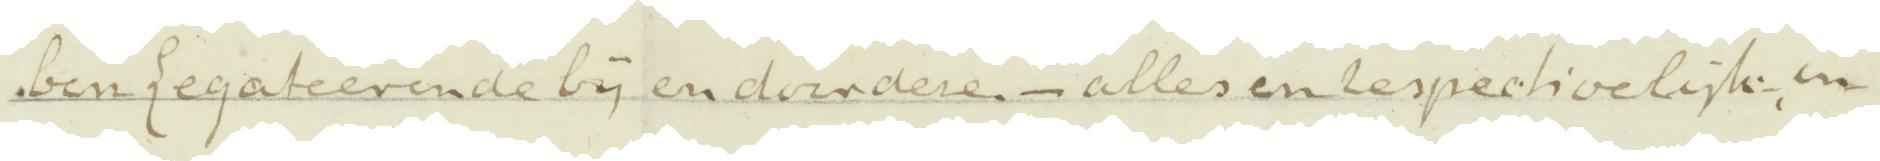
.ben Legateerende bij en door deze.- alles en respectivelijk, in
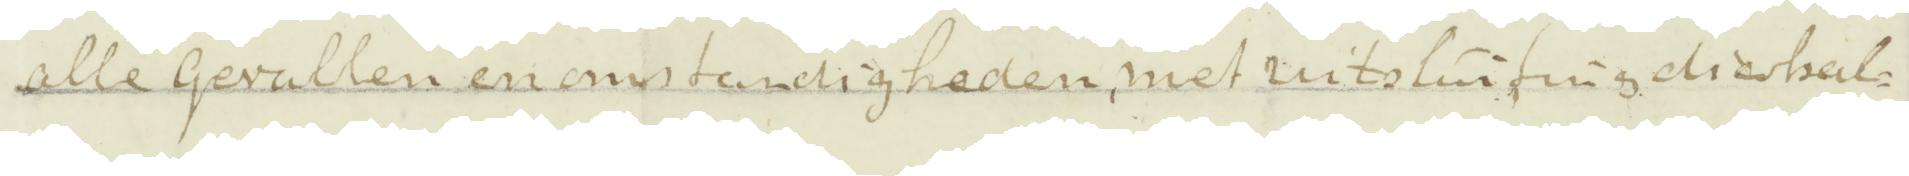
alle Gevallen en omstandigheden, met uitsluiting dierhal=
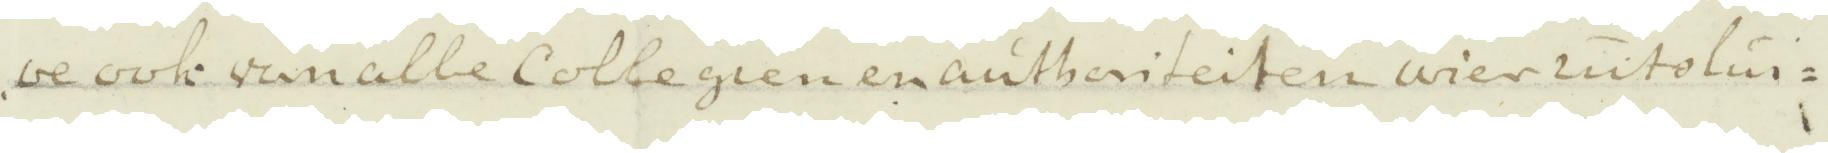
ve ook van alle collegien en authoriteiten wier uitslui=
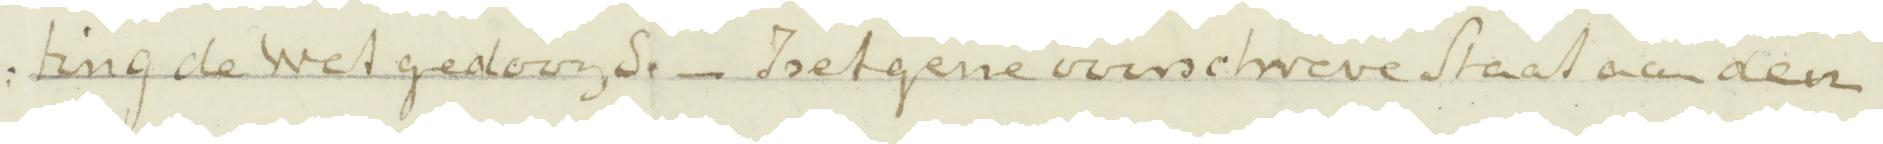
ting de wet gedoogd._ Hetgene voorschreve staat aan den
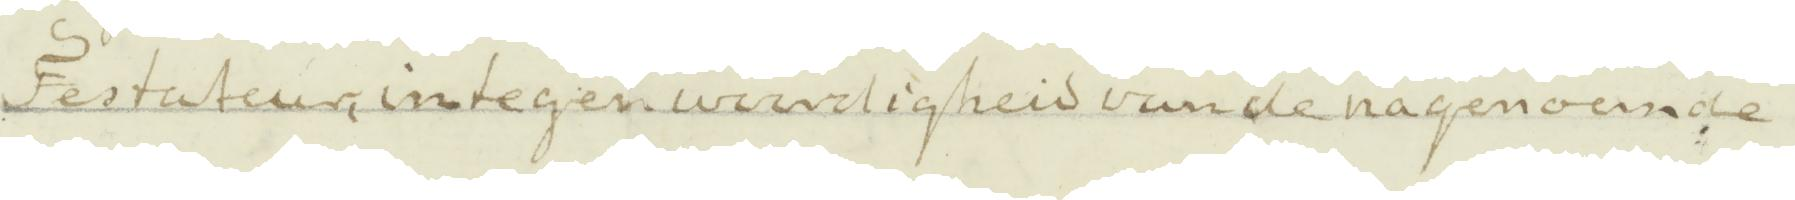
Testateur, in tegenwoordigheid van de nagenoemde
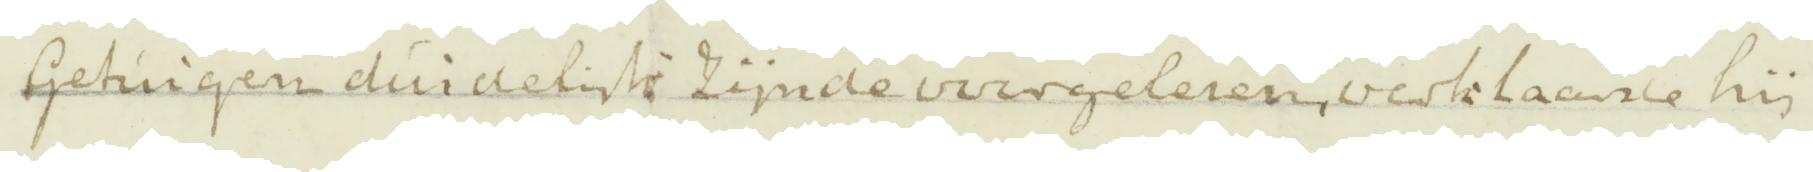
Getuigen duidelijk zijnde voorgelezen, verklaarde hij
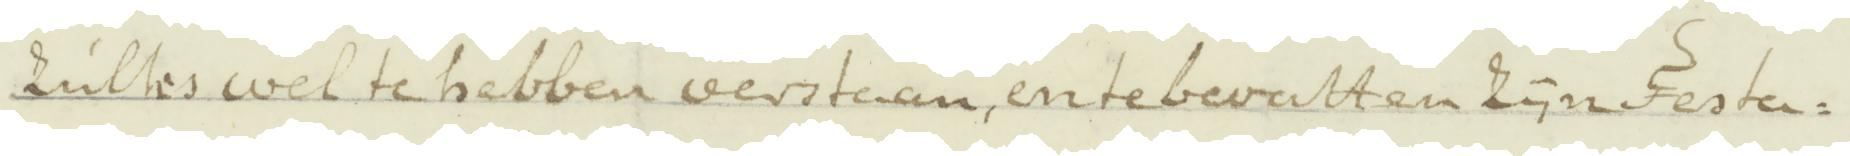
zulks wel te hebben verstaan, en te bevatten zijn Testa=
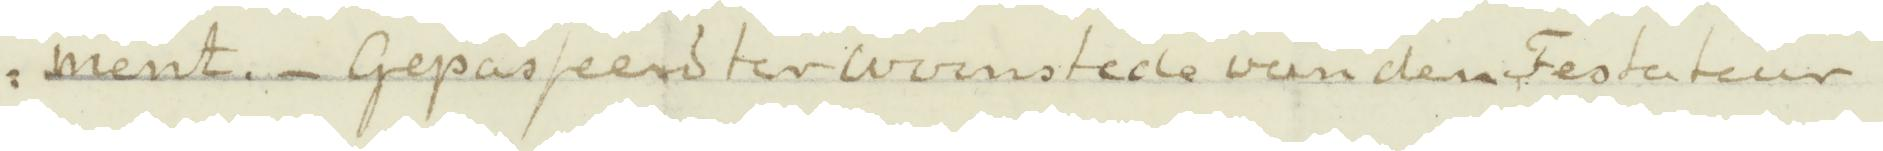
=ment._ Gepasseerd ter woonstede van den Testateur
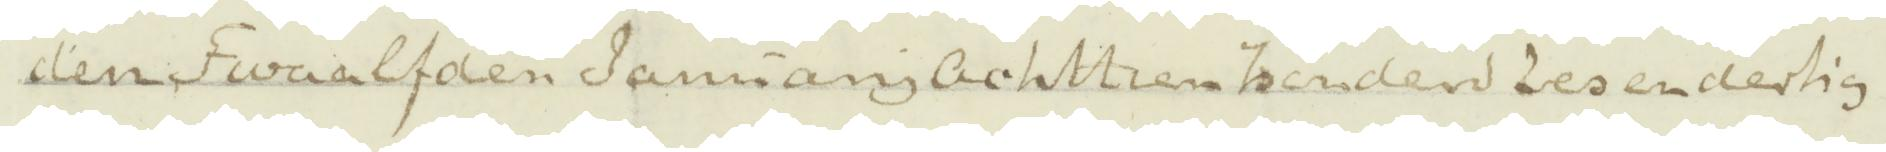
den Twaalfden Januarij Achttien Honderd Zes en dertig
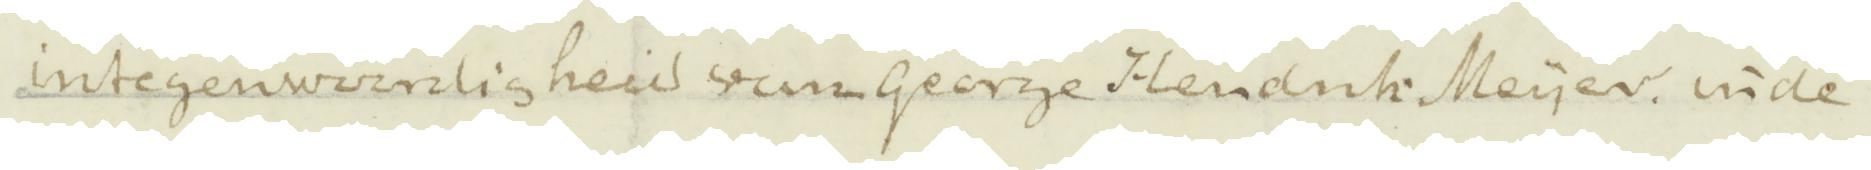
in tegenwoordigheid van George Hendrik Meijer, in de
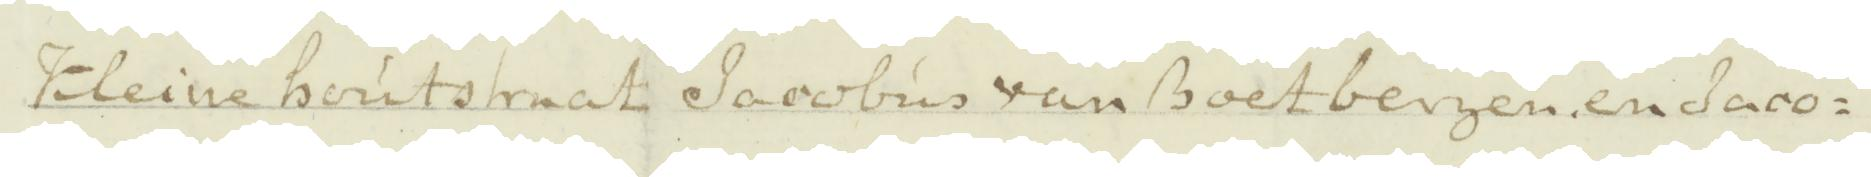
Kleine houtstraat Jacobus van Boetbergen. en Jaco=
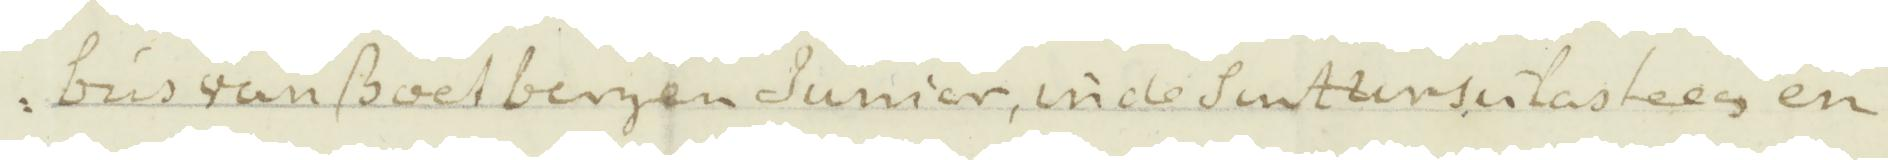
=bus van Boetbergen Junior, in de sint ursulasteeg en
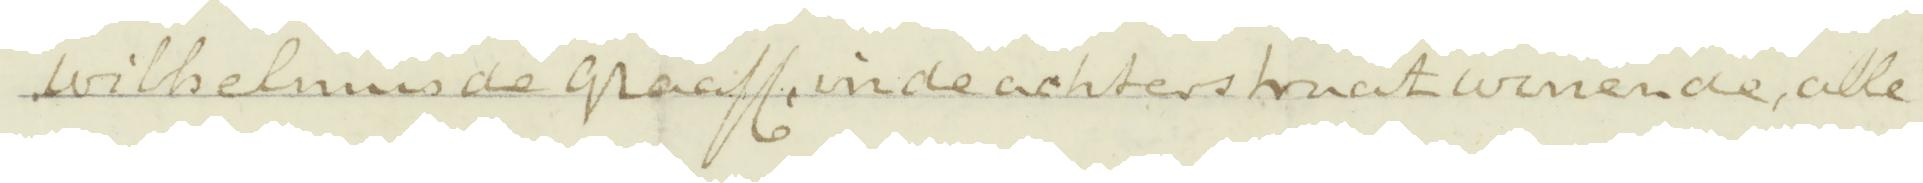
wilhelmus de graaff, in de achterstraat wonende, alle
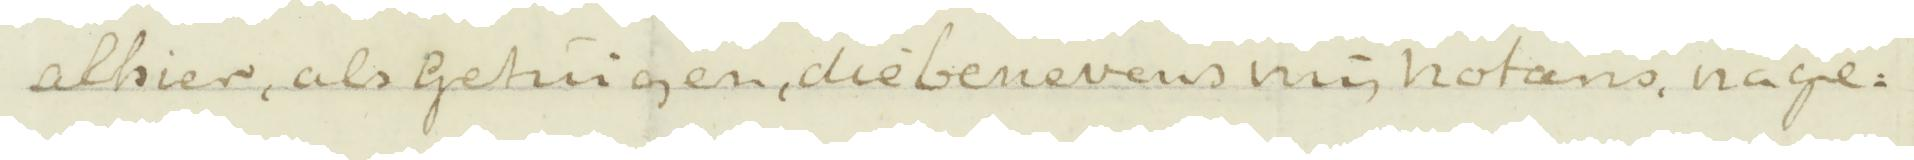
alhier, als Getuigen, die benevens mij Notaris, nage=
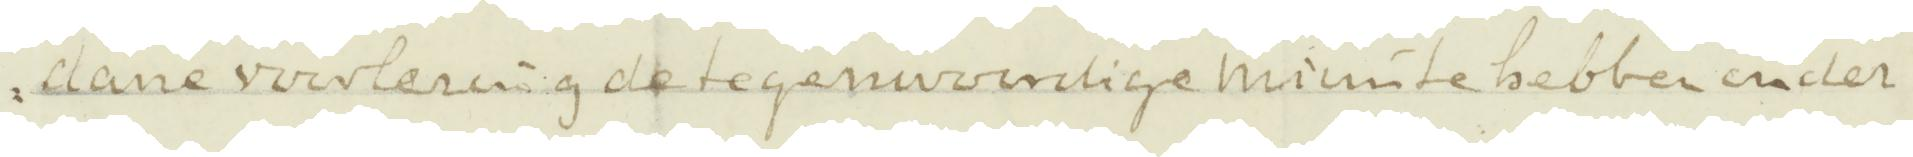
=dane voorlezing de tegenwoordige minute hebben onder
